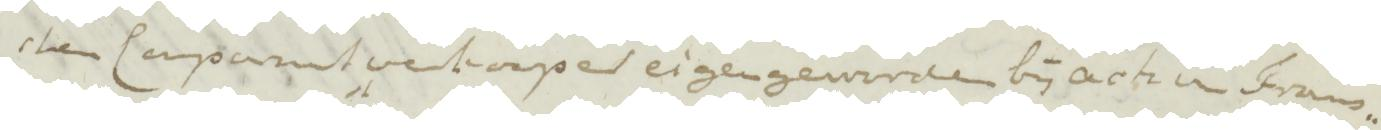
den Comparant verkoper eigendom geworden bij acte van Trans„
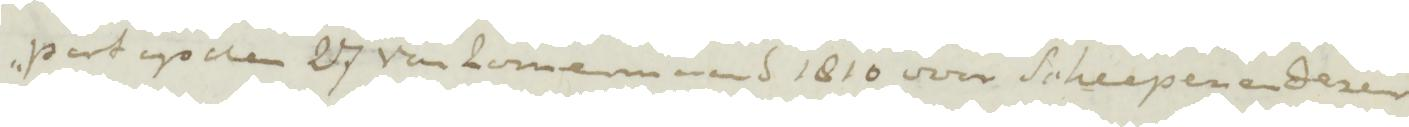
„port op den 27' van Zomermaand 1810 voor Scheepenen dezer
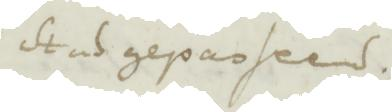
Stad gepasseerd.
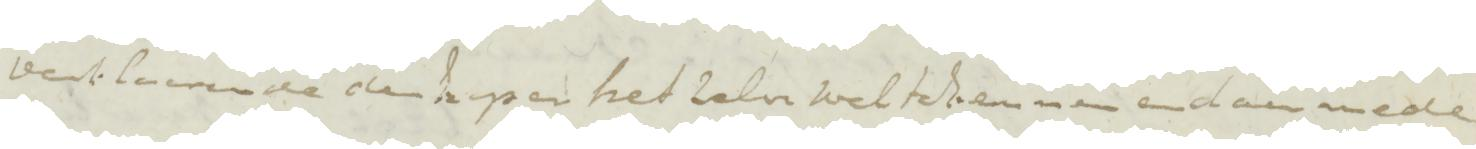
verklaarende de koper het zelve wel te kennen en daar mede
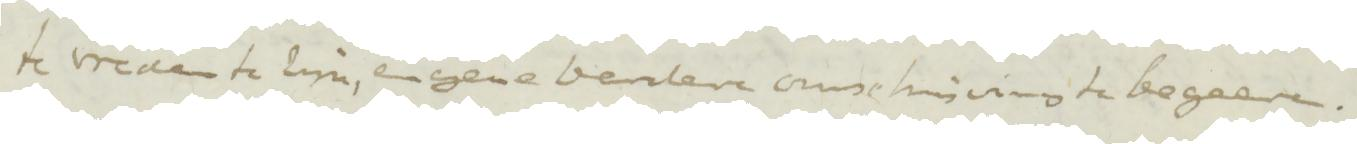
te vreden zijn en gene verdere omschrijving te begeeren.
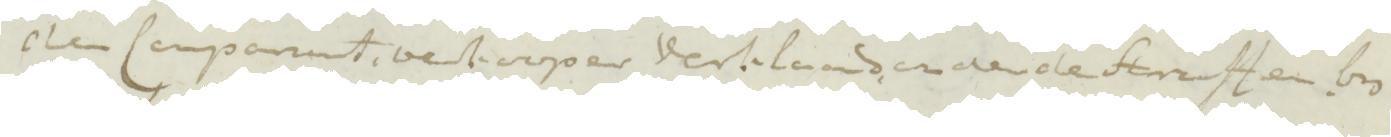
den Comparant, verkooper verklaard onder de Straffen, bij
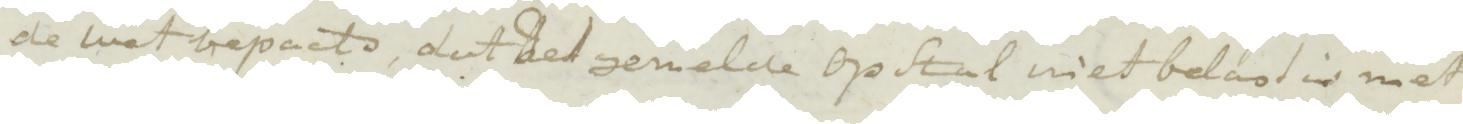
de wet bepaald, dat het gemelde opstal niet belast is met
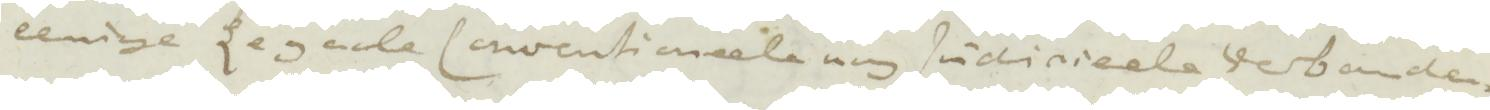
eenige Legaale Coventioneele nog Judicieele verbanden,
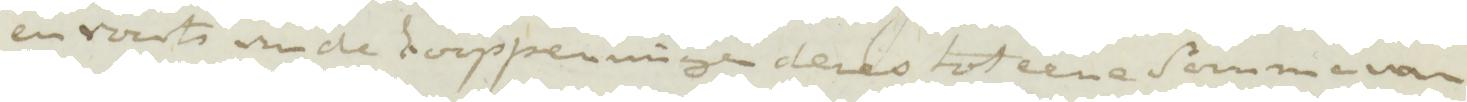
en voorts van de kooppenningen dezes tot eene Somma van
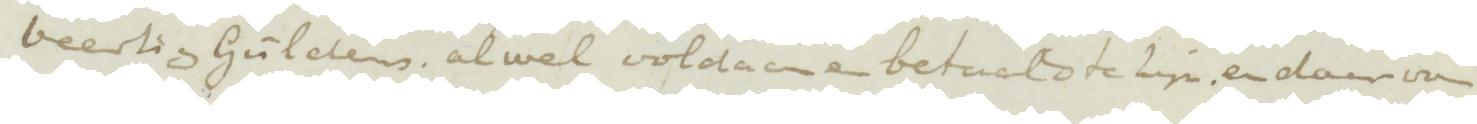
veertig Guldens, alwel voldaan en betaald te zijn, en daar van
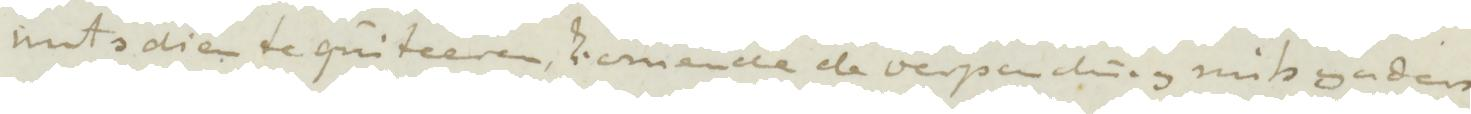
mitsdien te quiteeren, komende de verponding mitsgaders
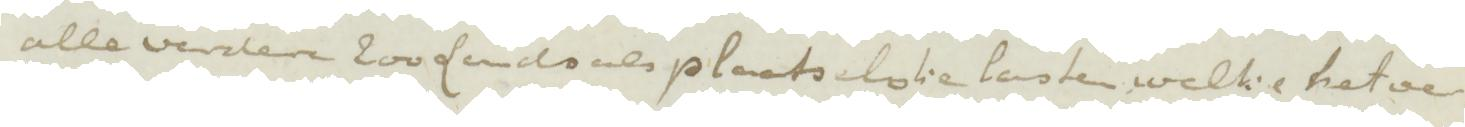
alle verdere Zoo Lands als plaatselyke lasten welke het ver.
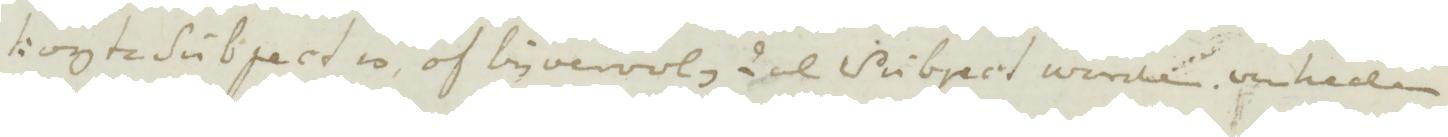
-kogte subject is, of bij vervolg zal Subject worden, van heden
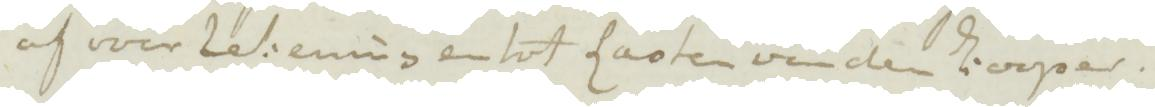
af voor rekening en tot Lasten van den kooper.
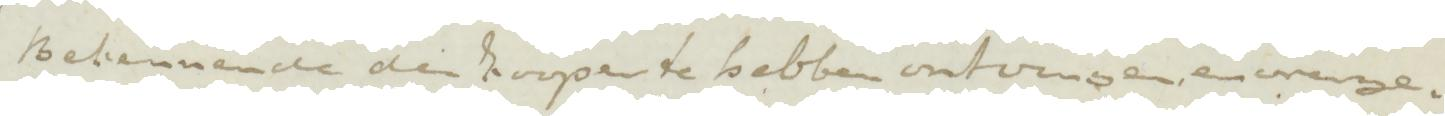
Bekennende den kooper te hebben ontvangen, en overge-
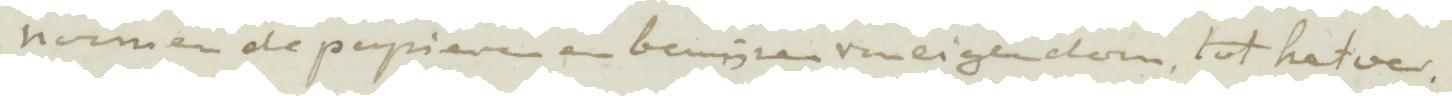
=nomen de papieren en bewijzen van eigendom, tot het ver,
